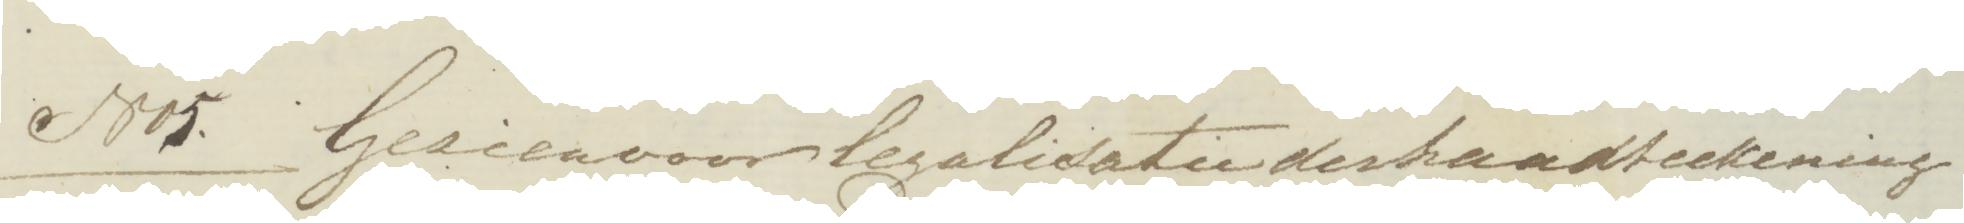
Not. Gezien voor legalisatie der handteekening
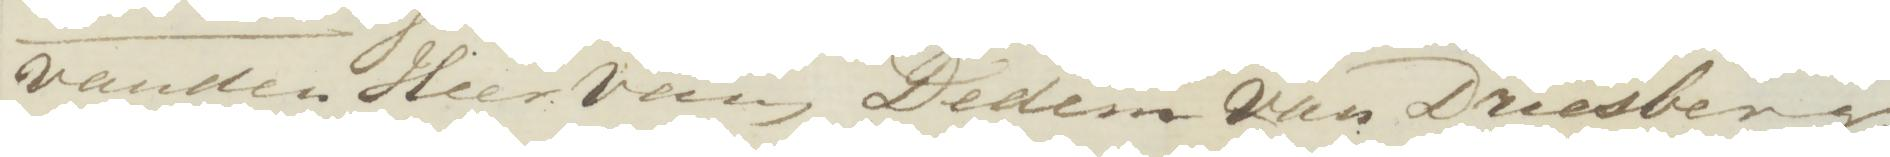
van den Heer van Dedem van Driesberg
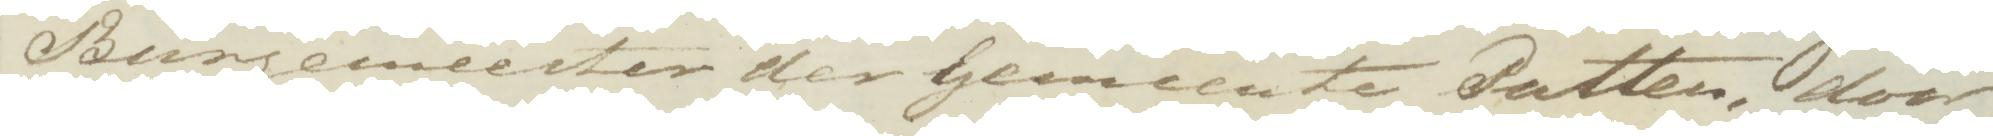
Burgemeester der Gemeente Putten, door
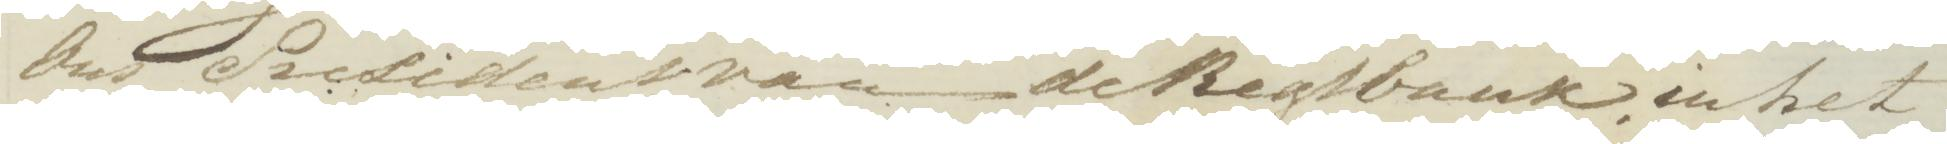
den President van de Regtbank, in het
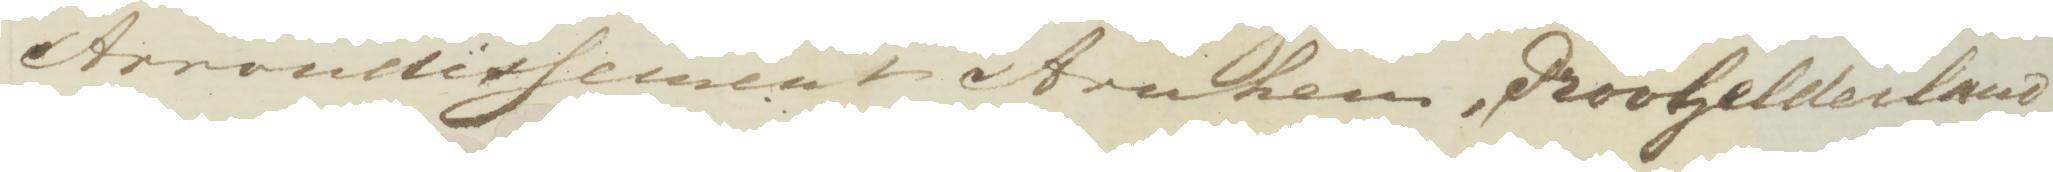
Arrondissement Arnhem, ProvGelderland,
